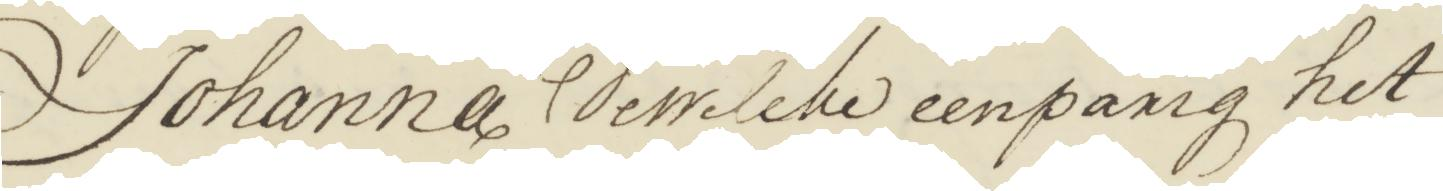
Johanna dewelcke eenparig het
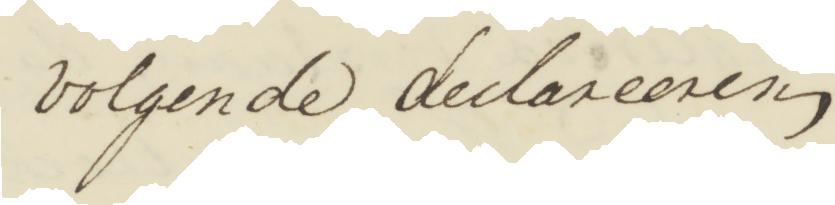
volgende declareeren
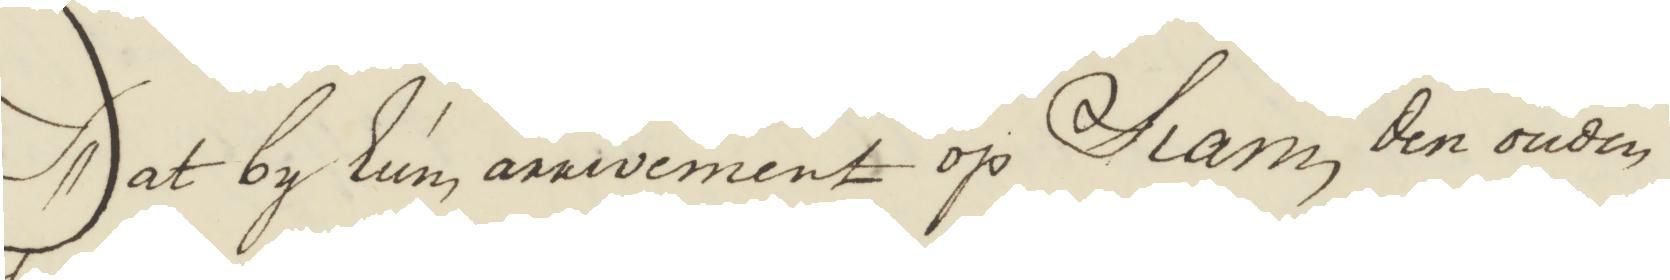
Dat by hun arrivement op Siam den ouden
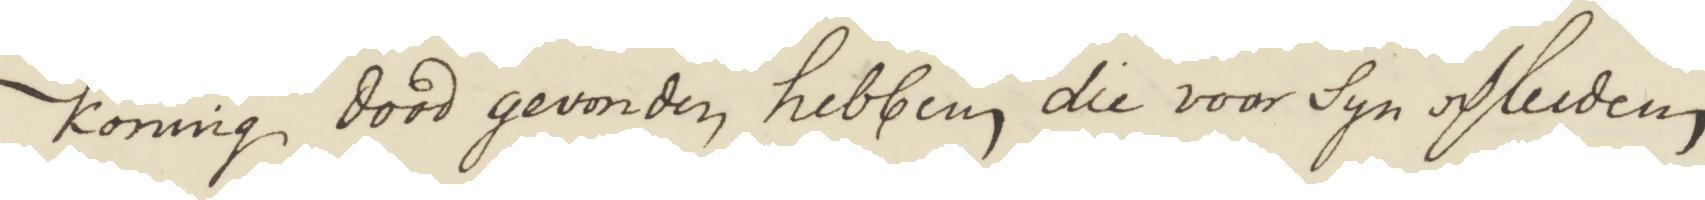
koning dood gevonden hebben die voor syn overleiden
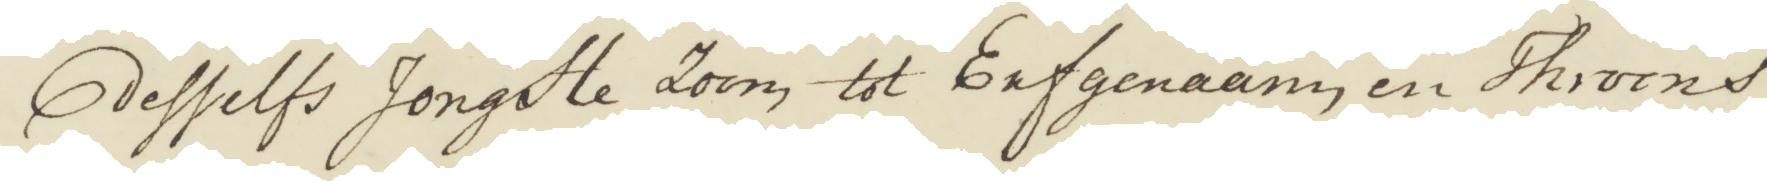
desselfs jongste zoon tot Erfgenaam en Throons
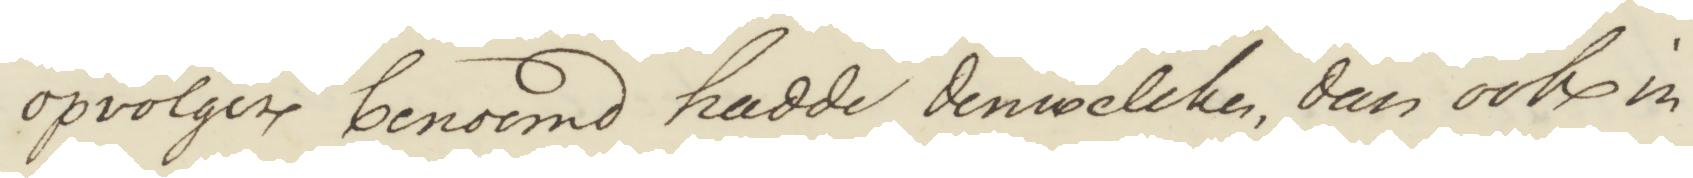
opvolger benoemd hadde denwelcke, dan ook in
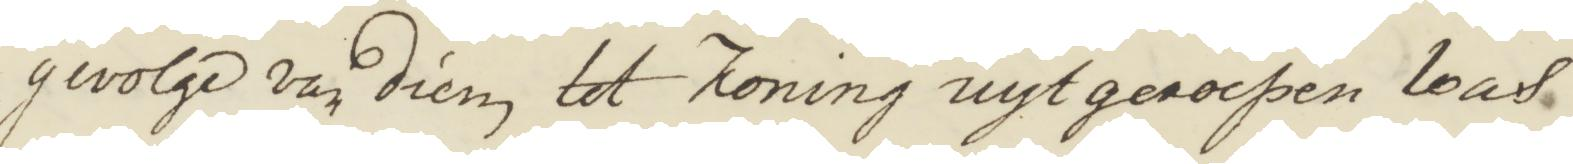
gevolge van dien tot koning uijtgeroepen was
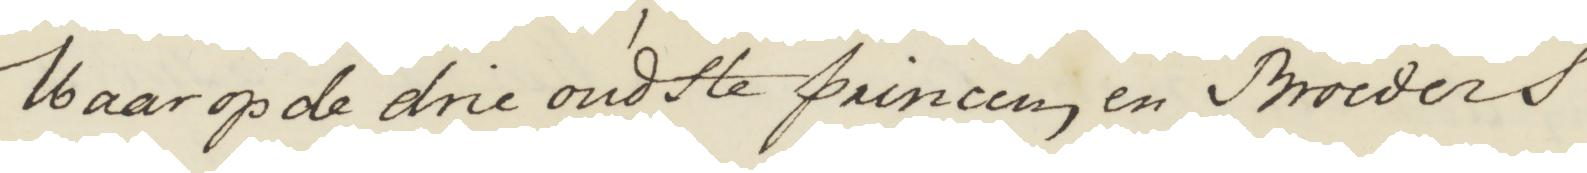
Waar op de drie oudste princen en Broeders
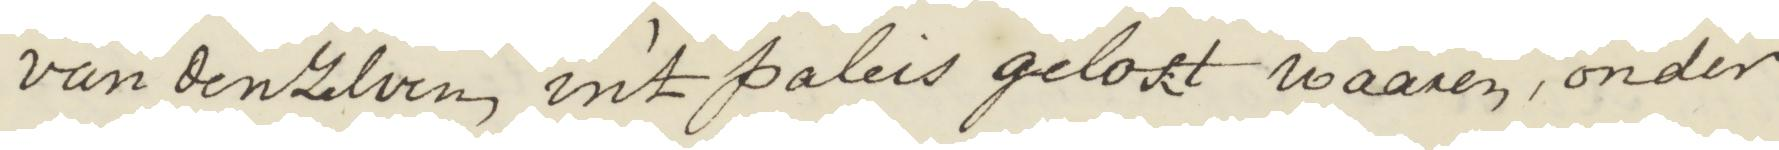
van denzelven in 't paleis gelokt waaren, onder
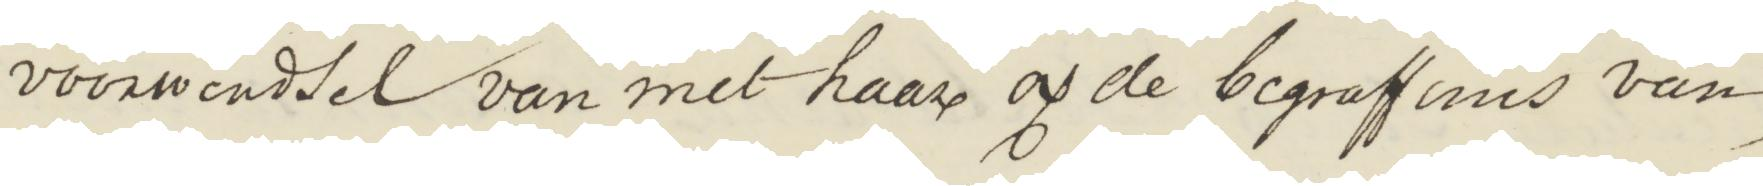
voorwendsel van met haar op de begraffenis van
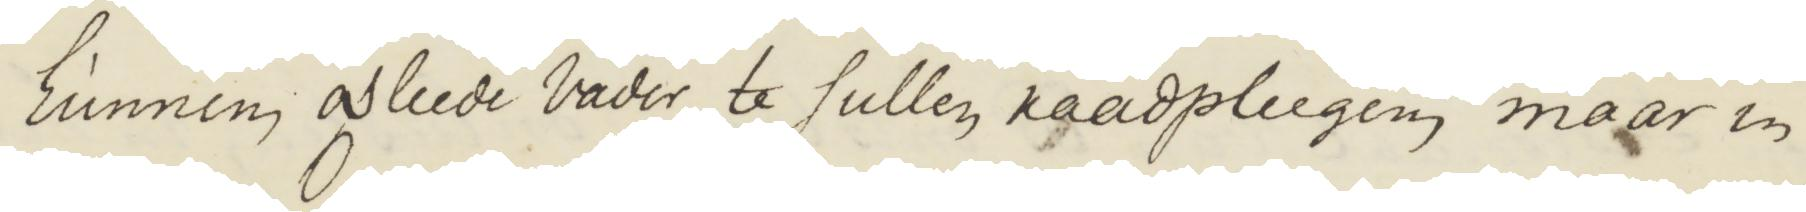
hunnen overleede vader te sullen raadpleegen maar in
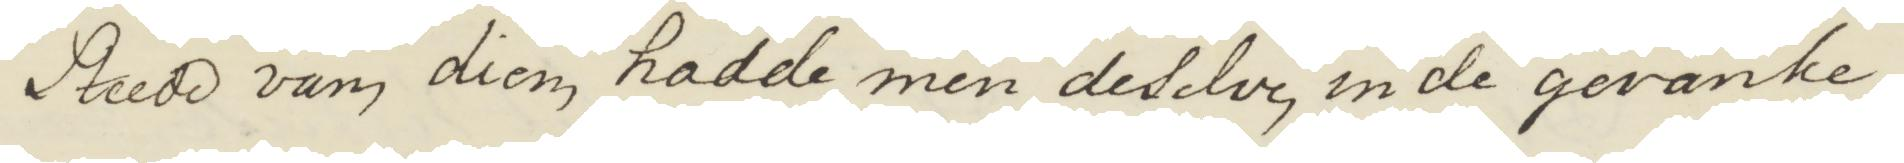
steede van dien hadde men deselve in de gevanke
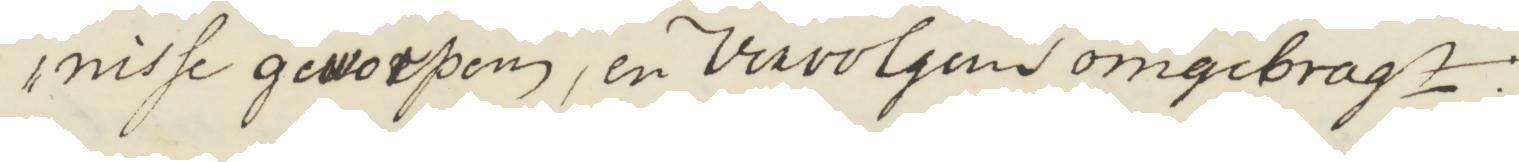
„nisse geworpen, en vervolgens omgebragt:
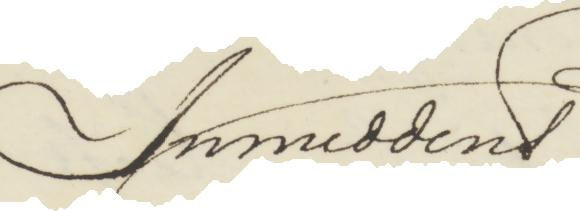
Jnmiddens
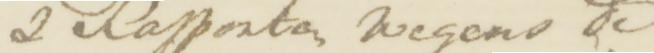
2 Rapporten wegens de
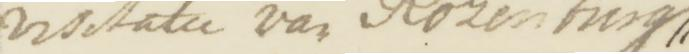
visitatie van Rozenburg„
